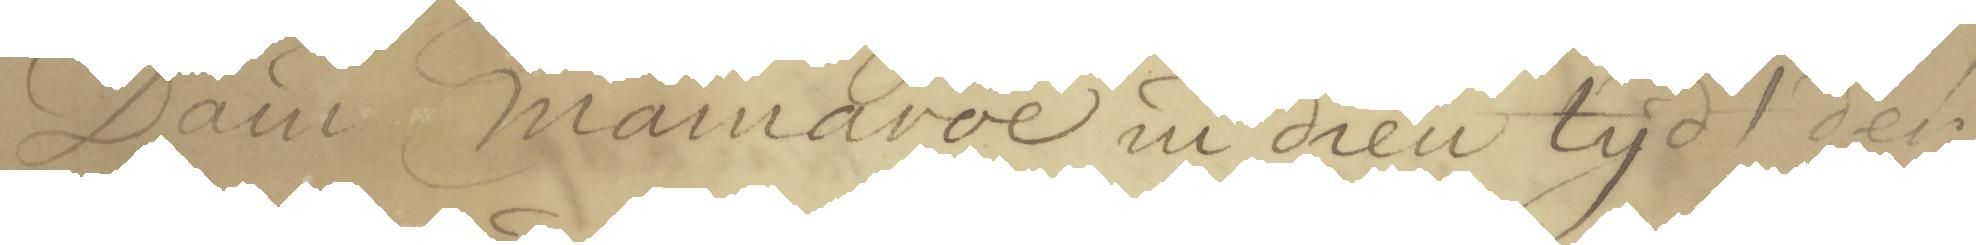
Dain manaroe in dien tijdt der
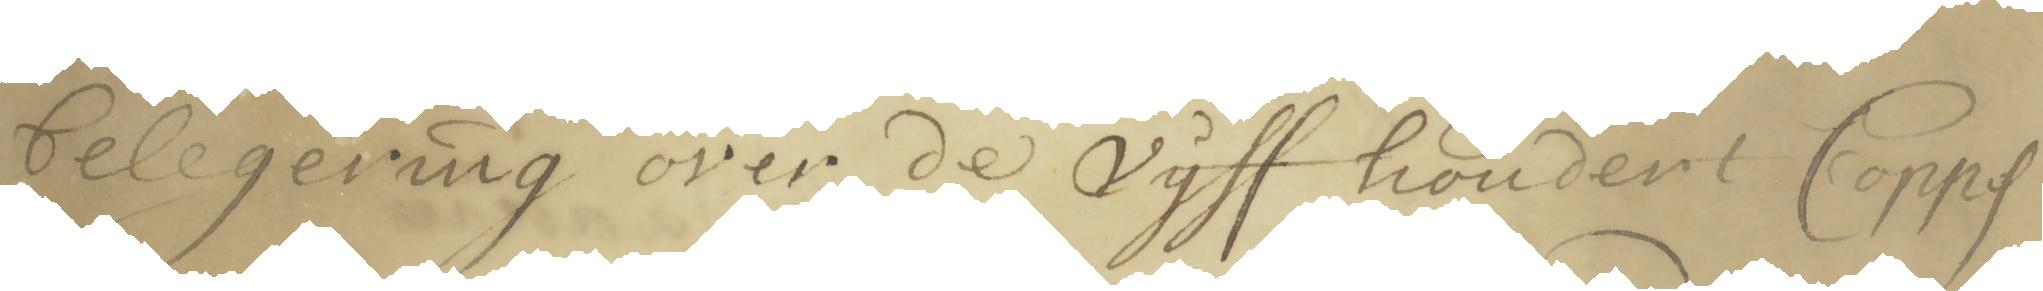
belegering over de vijff hondert Coppen
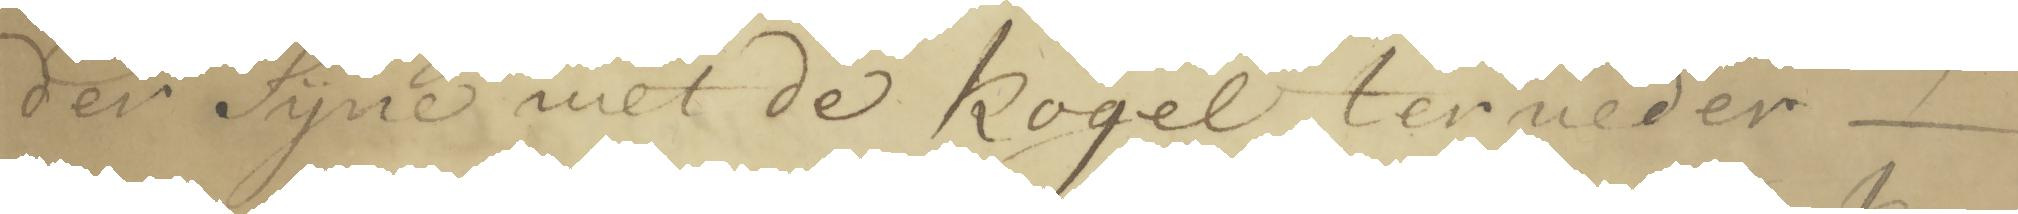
der sijne met de kogel ter neder —
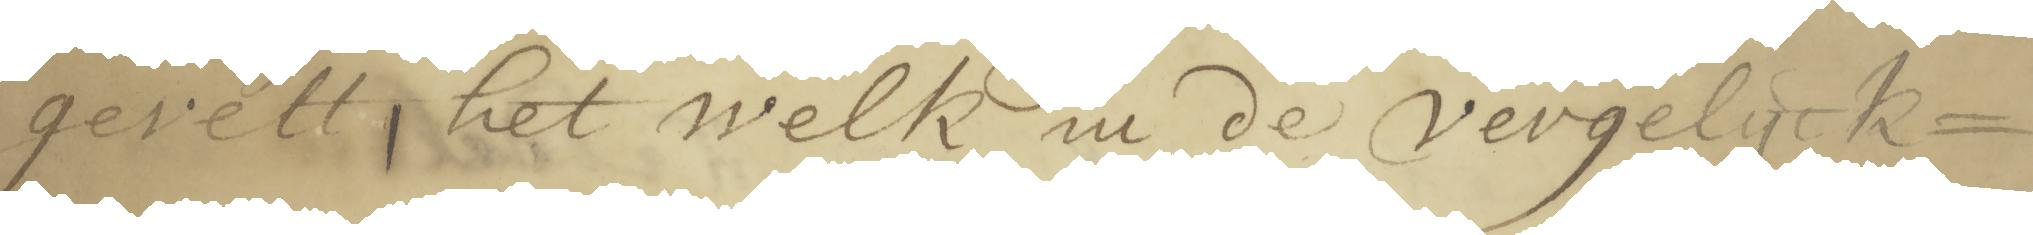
gevelt, het welk in de vergelijck=
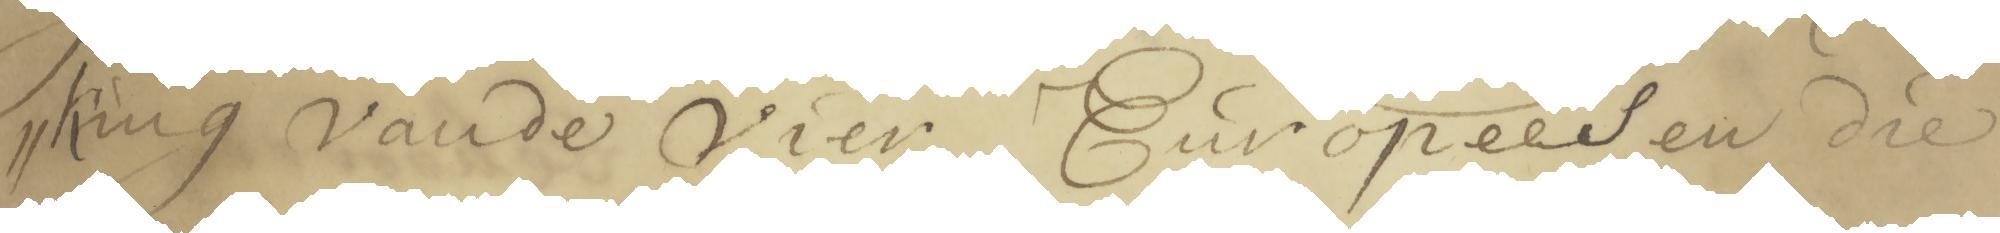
„king vande vier Europeesen die
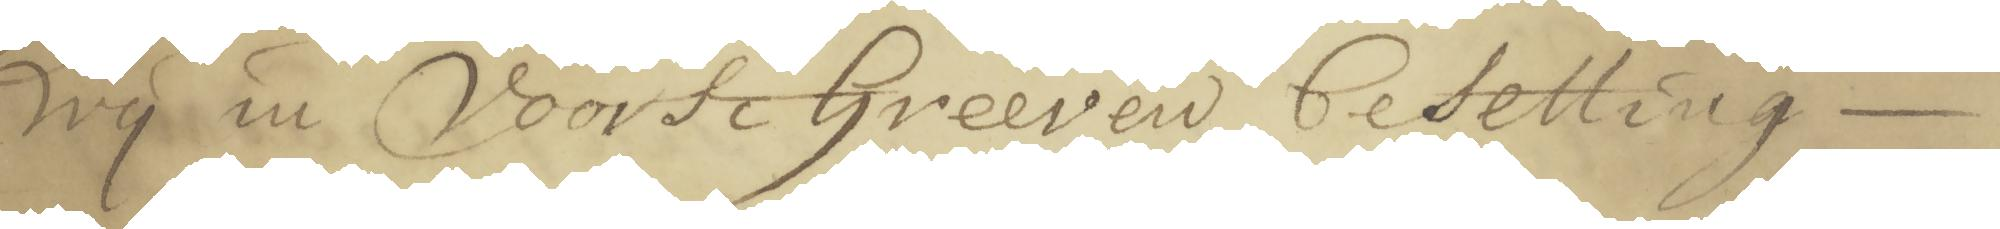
wij in voorschreeven besetting —
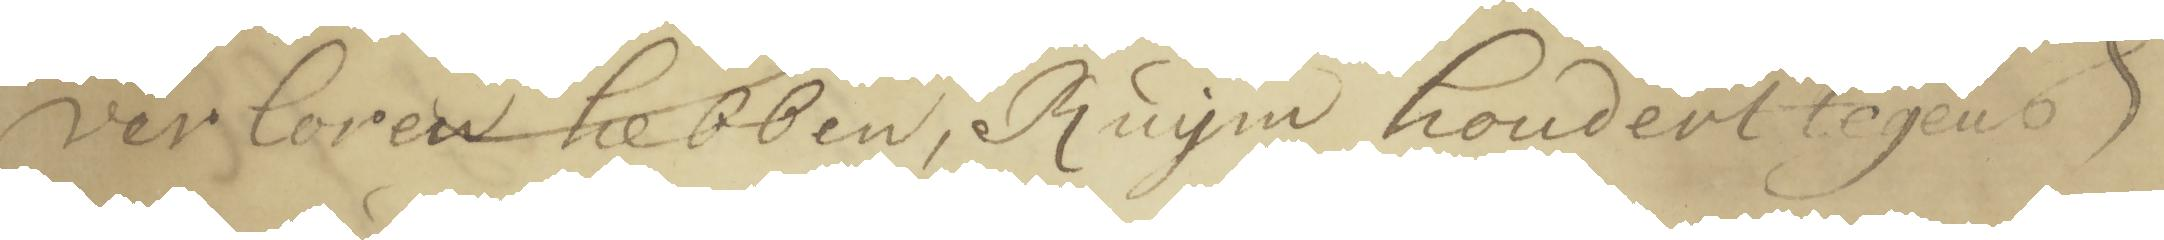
verloren hebben, Ruijm hondert tegens
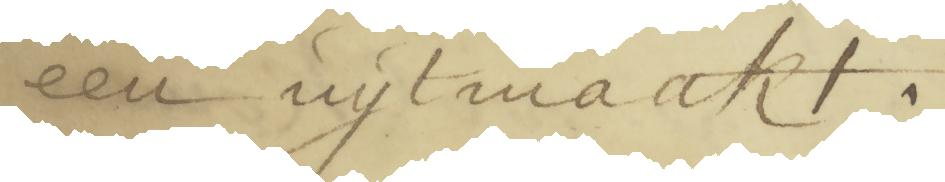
een uijtmaakt.
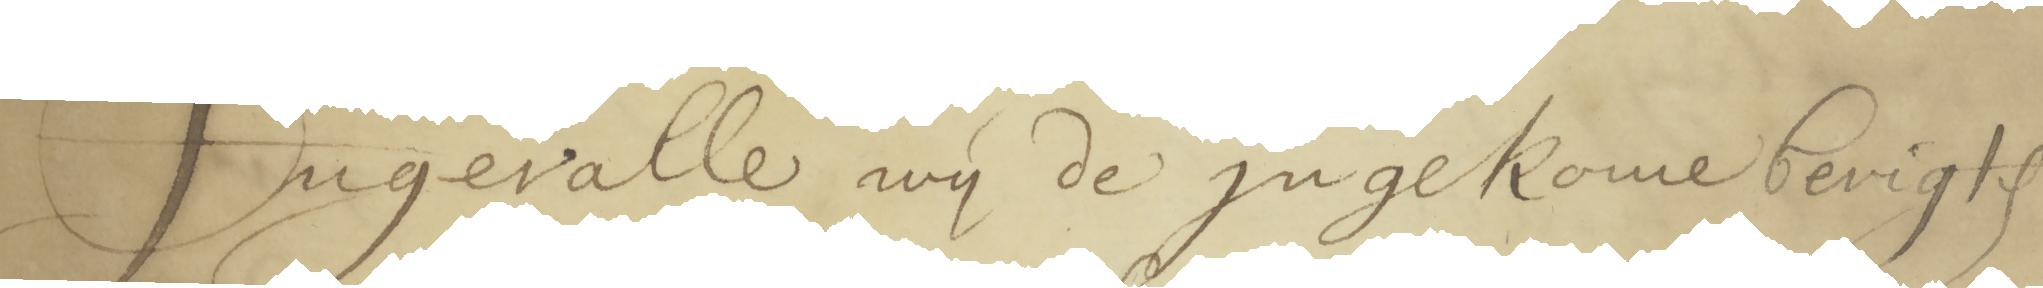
Jngevalle wij de jngekome berigten
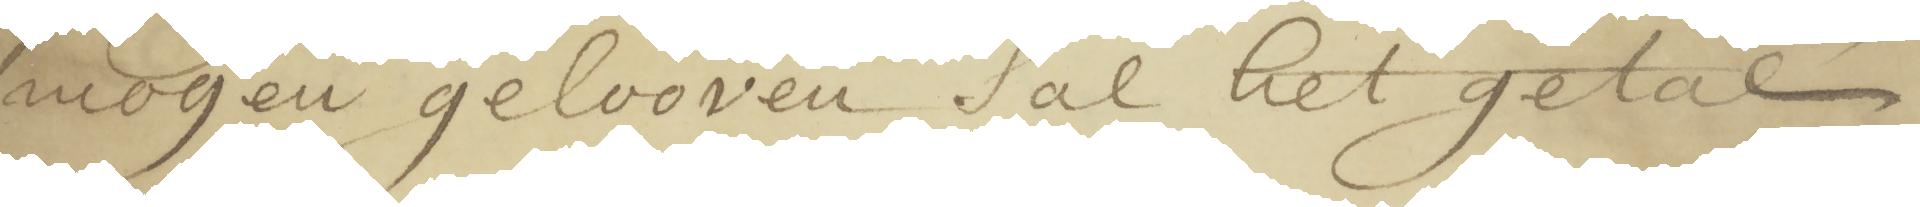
mogen gelooven sal het getal
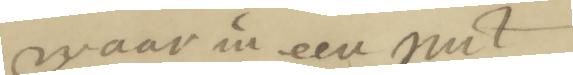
waar in een put
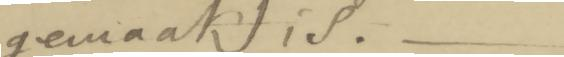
gemaakt is. —
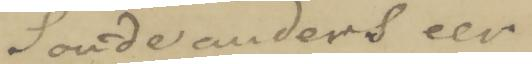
soude anders eer
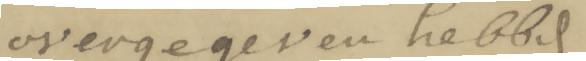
overgegeven hebben
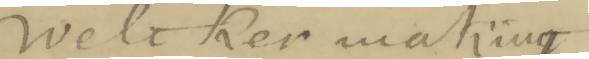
welcker making
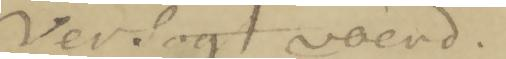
versogt werd.
